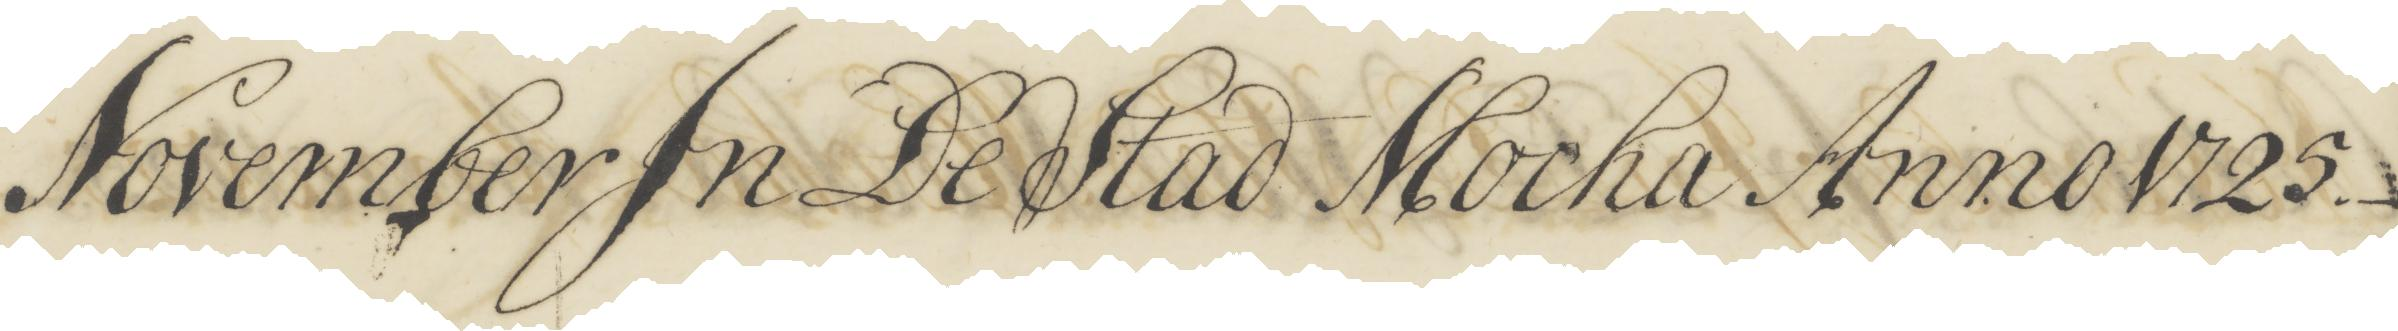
November Jn De Stad Mocha Anno 1725. —
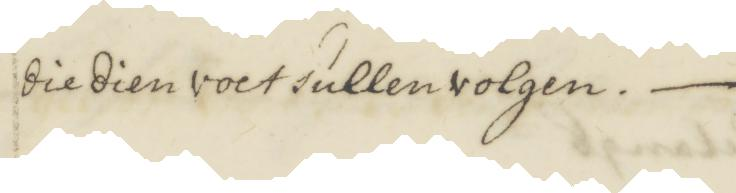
die dien voet sullen volgen. —
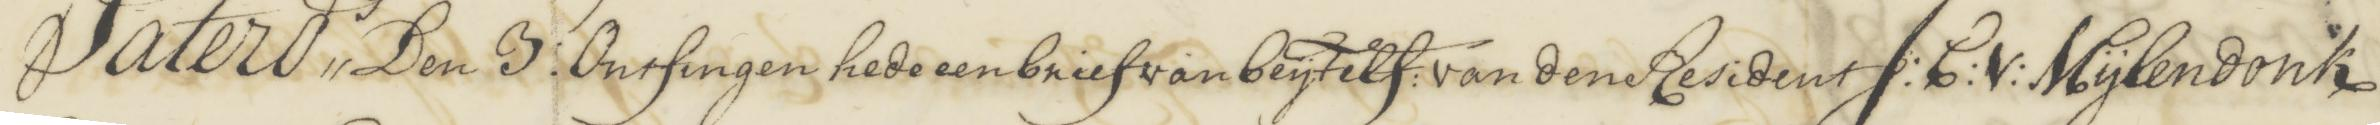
Saterd„h Den 3:' Ontfingen hede een brief van beijtilf: van den Resident J: E: v: Wijlendonk
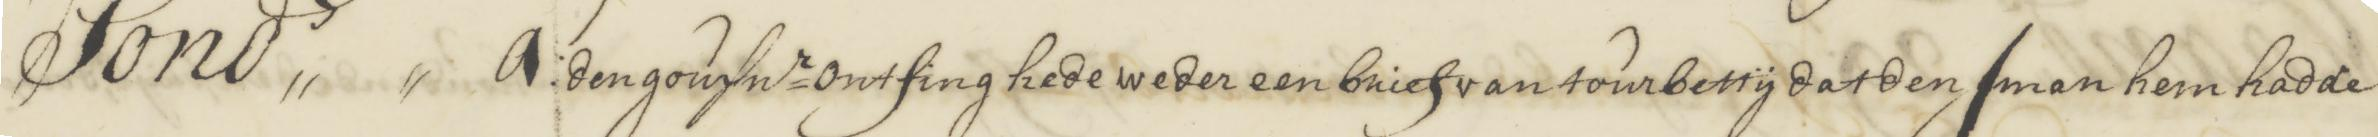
Sond„h „ 4:' den gouvern=r ontfing hede weder een brief van tourbettij dat den Jman hem hadde
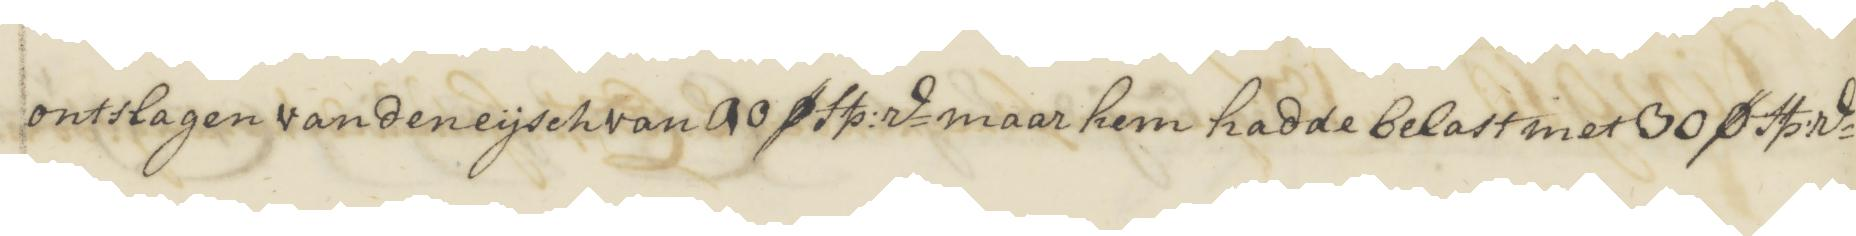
ontslagen van den eijsch van 40 Ø sp: r=l maar hem hadde belast met 30 Ø sp: r=l
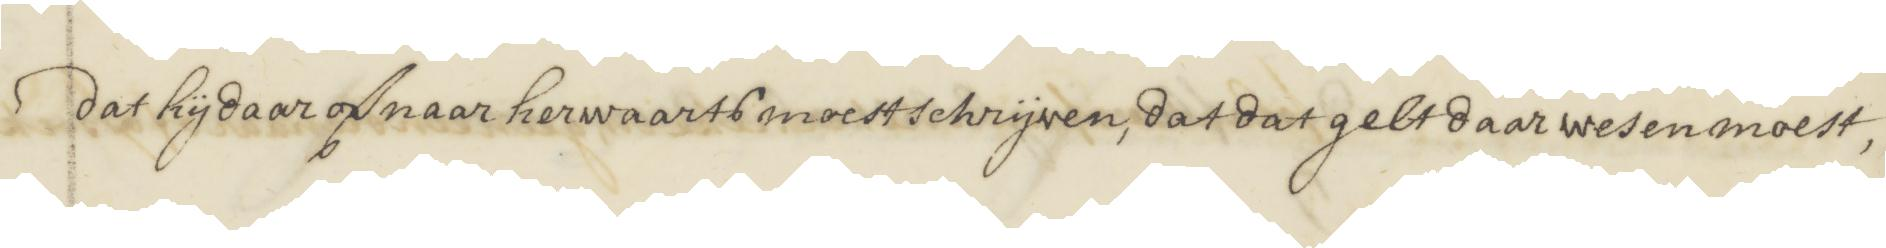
dat hij daar over naar herwaarts moest schrijven, dat dat gelt daar wesen moest,
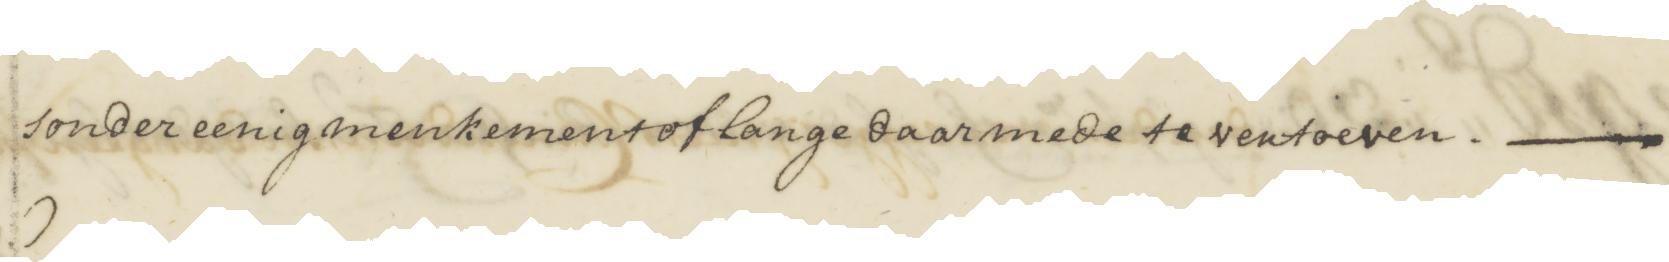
sonder eenig menkement of lange daarmede te vertoeven. —
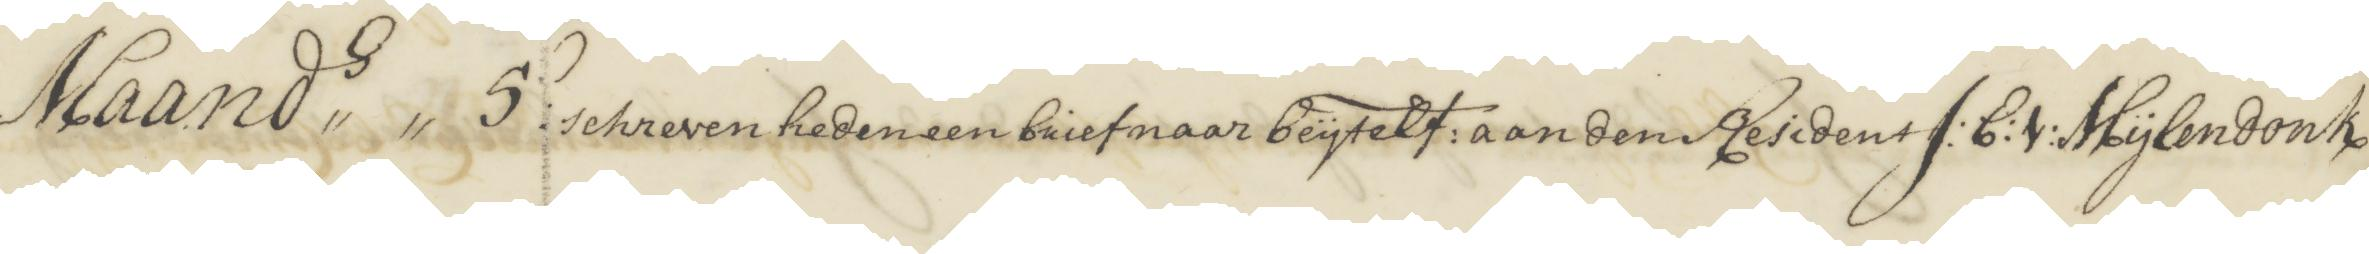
Maand„h „ 5:' schreven heden een brief naar beijtelf: aan den Resident J: E: v: Mijlendonk
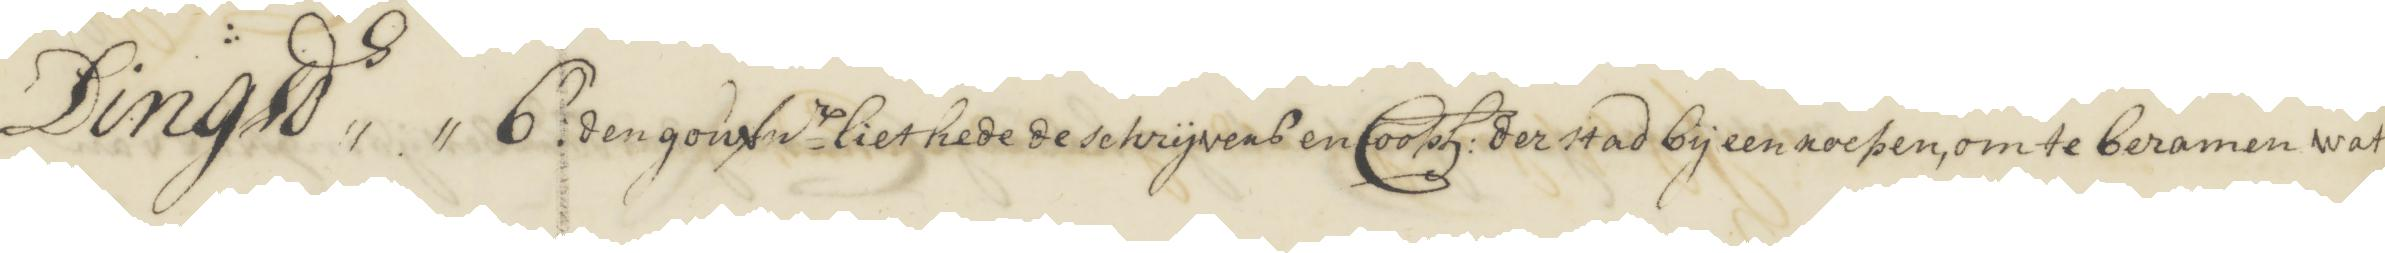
Dingsd„h „ 6:' den gouvern=r liet hede de schrijvers en Cooph: der stad bij een roepen, om te beramen wat
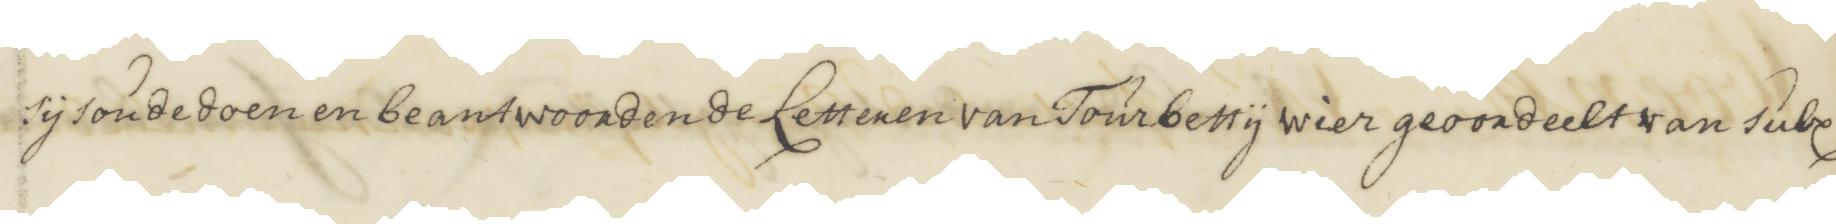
sij soude doen en beantwoorden de Letteren van Tourbettij wier geoordeelt van sulx
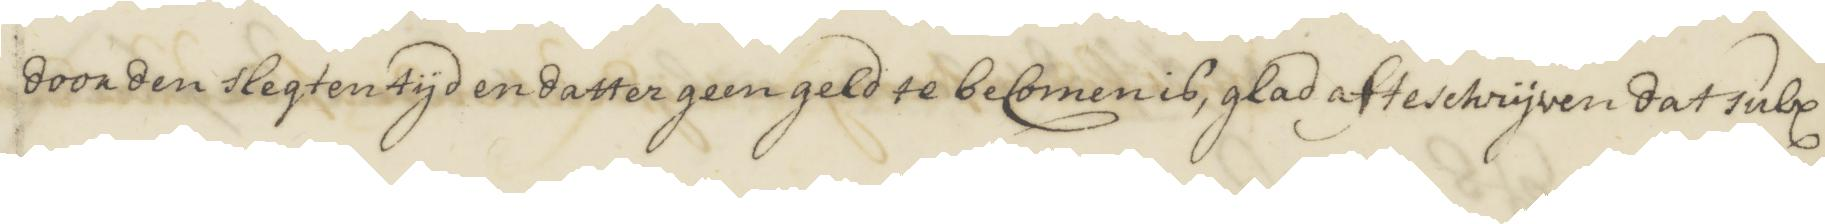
door den slegten tijd en datter geen geld te becomen is, glad afteschrijven dat sulx
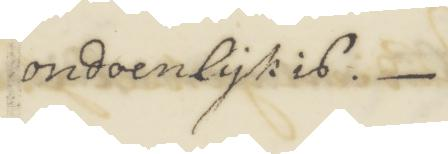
ondoenlijk is. —
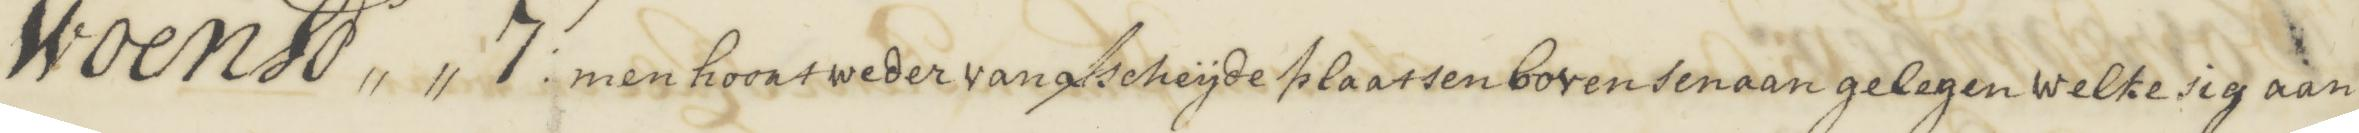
Woensd„h „ 7:' men hoort weder van verscheijde plaatsen boven senaan gelegen welke sig aan
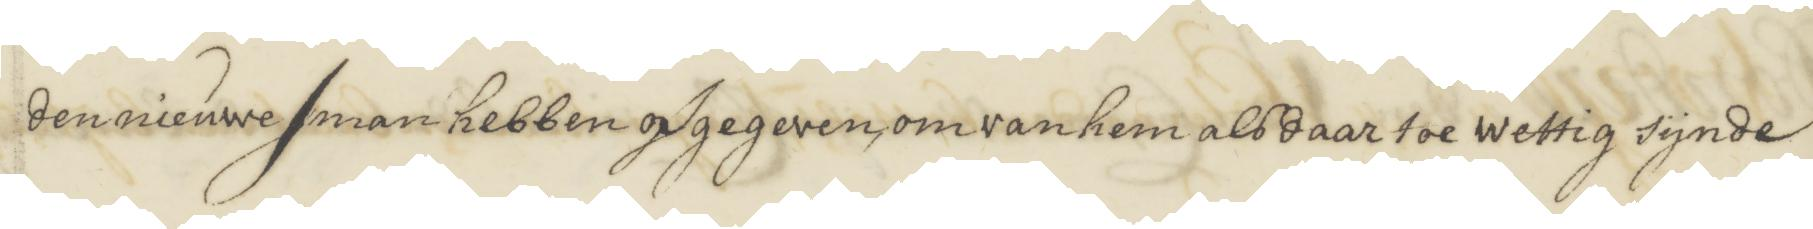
den nieuwe Jman hebben overgegeven, om van hem als daar toe wettig sijnde
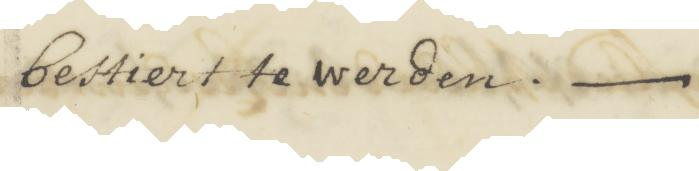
bestiert te werden. —
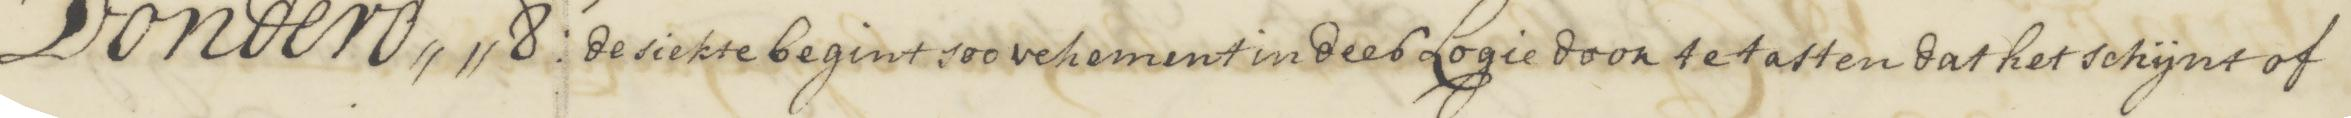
Donderd„h „ 8:' de siekte begint soo vehement in dees Logie door te tasten dat het schijnt of
